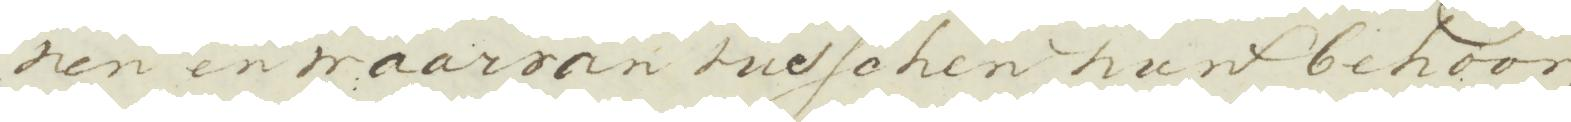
ven en waarvan tusschen hun behoor
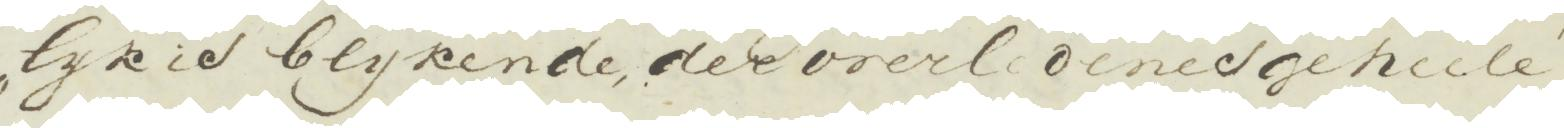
„lyk is blykende, der overledenes geheele
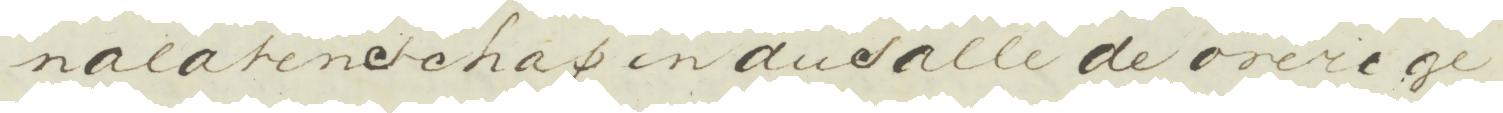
nalatenschap in dus alle de overige
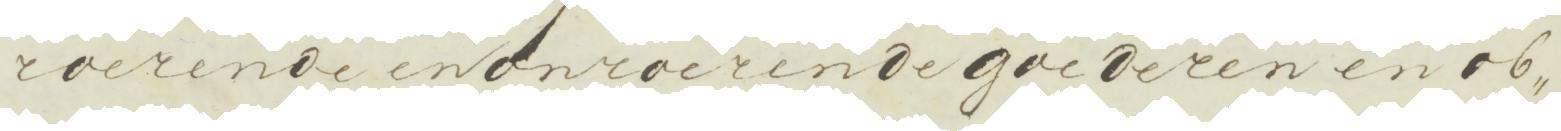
roerende en onroerende goederen en ob„
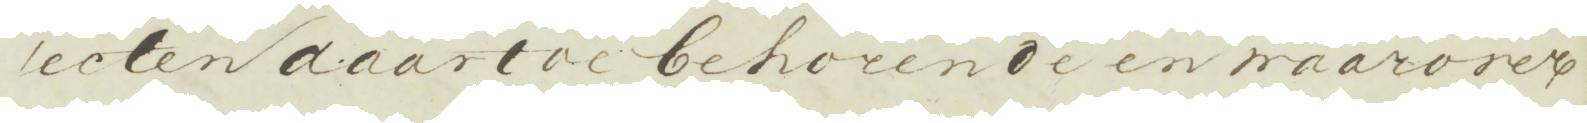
jecten daartoe behorende en waarover
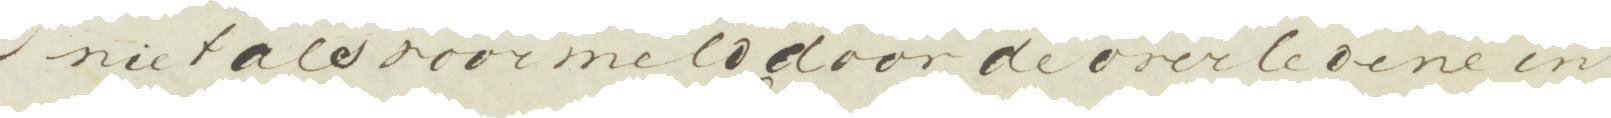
niet als voormeld door de overledene in
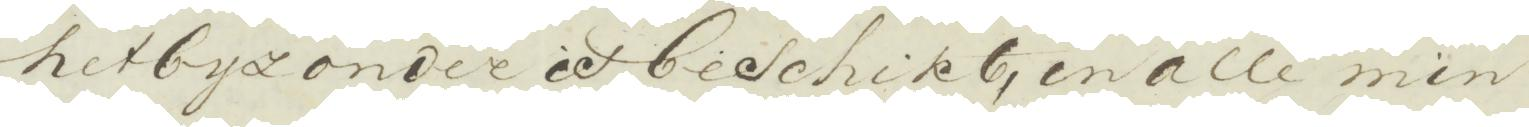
het byzonder is beschikt, in alle min
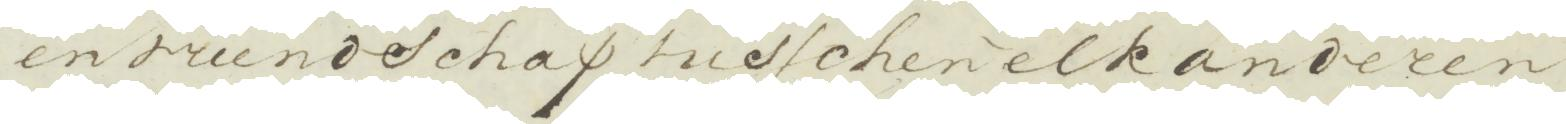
en vriendschap tusschen elk anderen
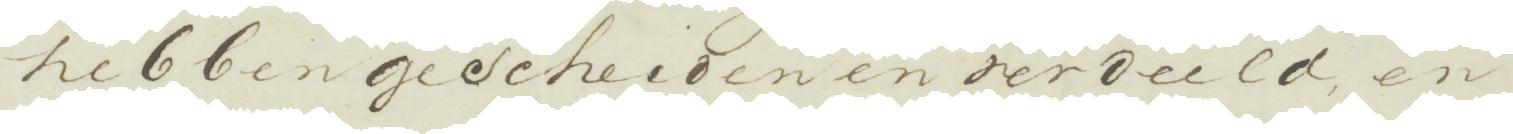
hebben gescheiden en verdeeld, en
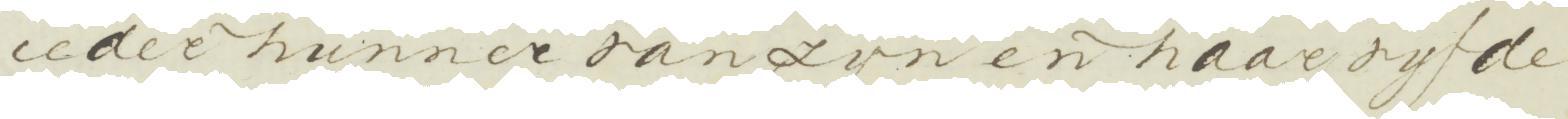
ieder hunner van zyn en haar vyfde
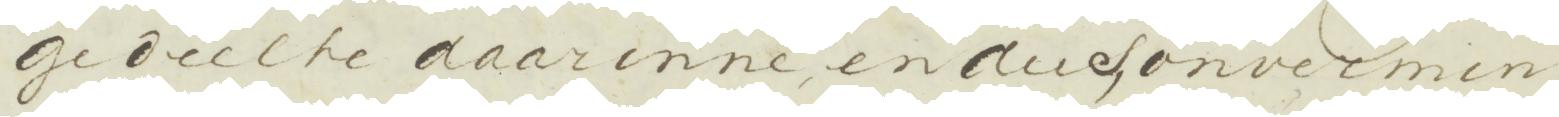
gedeelte daarinne, en dus onvermin
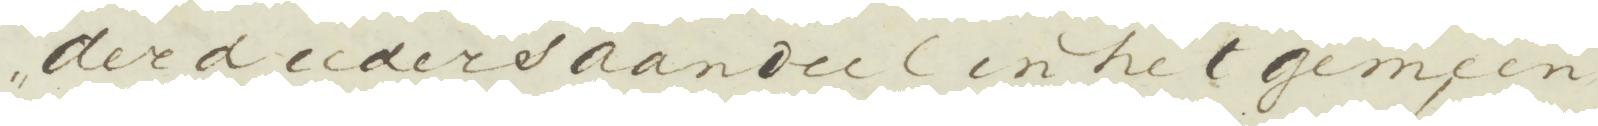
„derd ieders aandeel in het gemeen
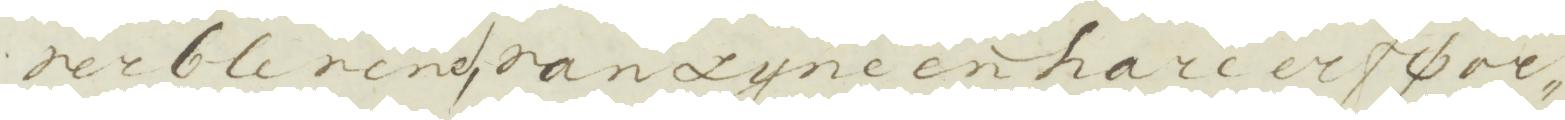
verblevene, van zyne en hare erf por„
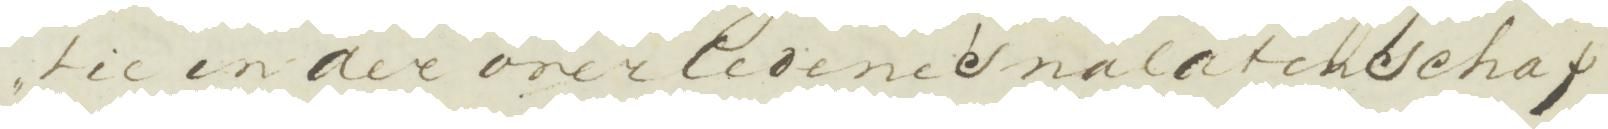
„tie in der overledene's nalatenschap
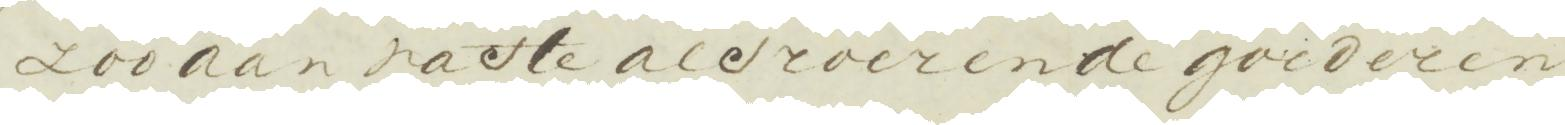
zoo aan vaste als roerende goederen
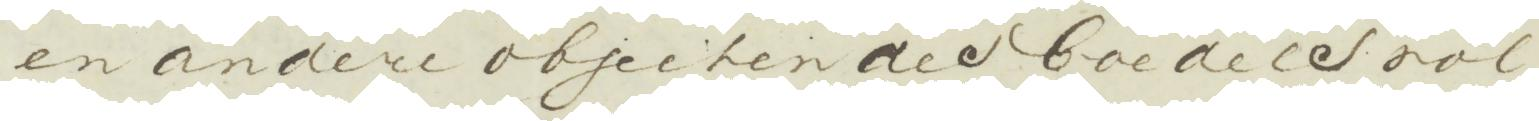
en andere objecten des boedels vol
